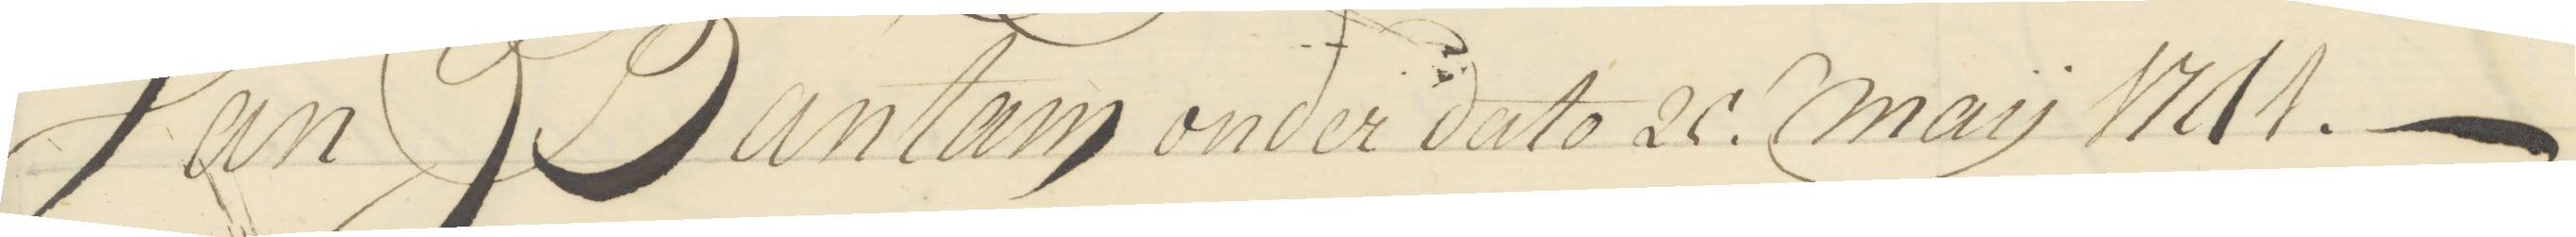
Van Bantam onder dato 25. Maij 1741. —
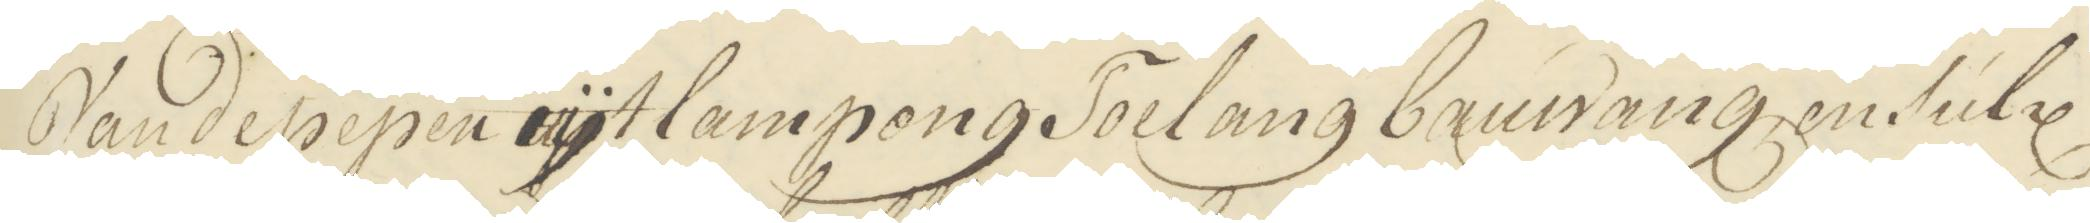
van de peper uijt lampong Toelang bauwang, en sulx
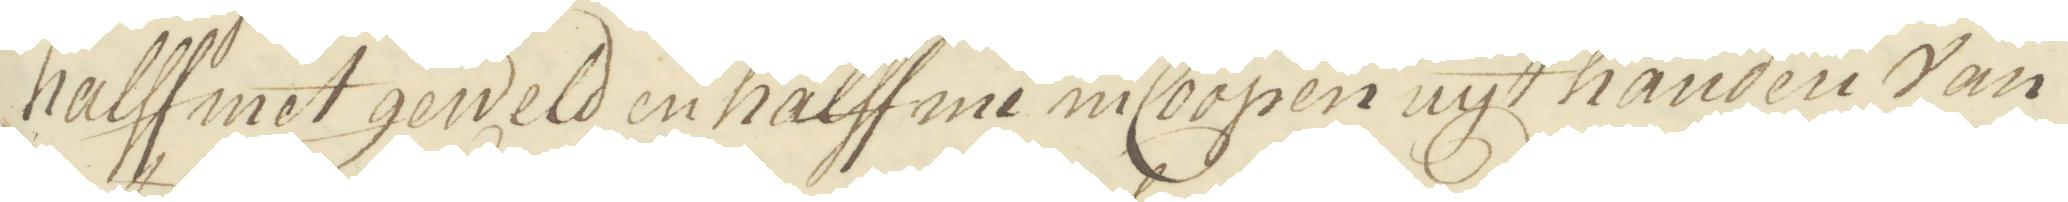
halff met geweld en halffom incoopen uijt handen van
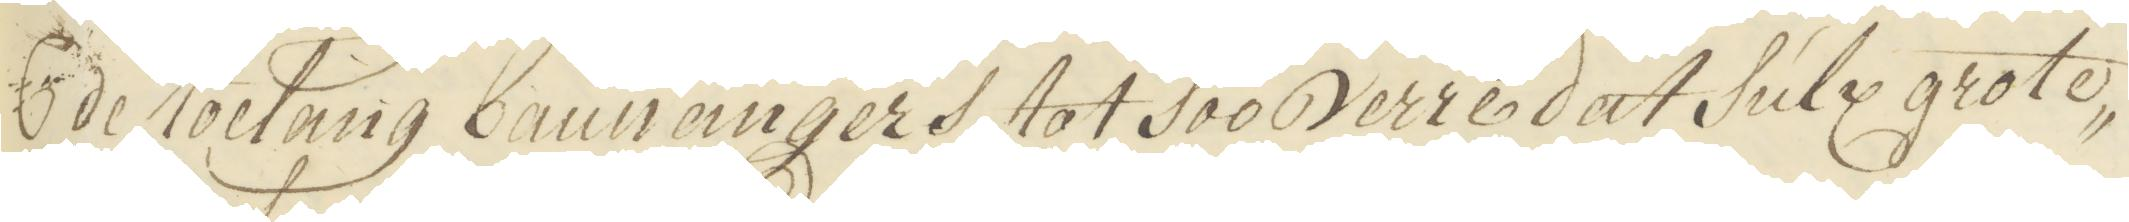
6 de toelang bauvangers, tot soo verre dat sulx grote„
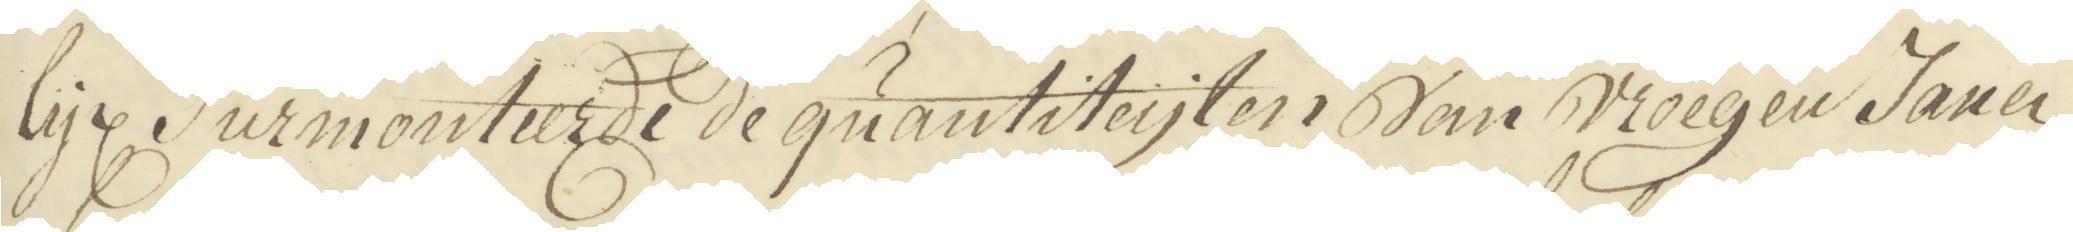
lijx surmonteerde de quantiteijten van vroeger Jaren,
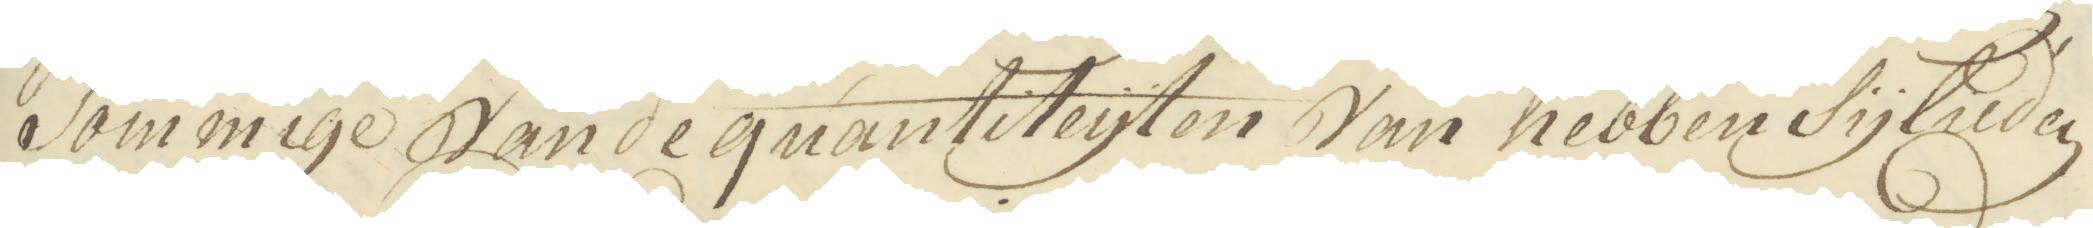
sommige van de quantiteijten van hebben sijlieden
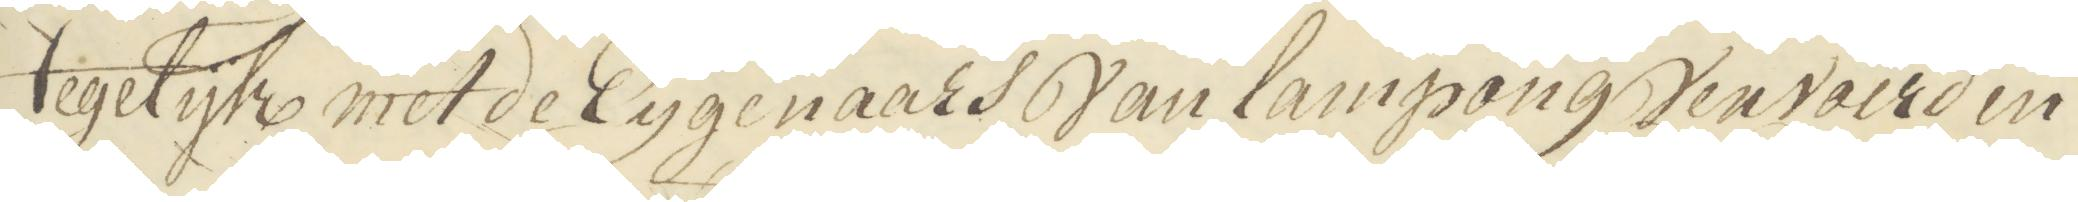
tegelijk met de Eygenaars van lampong vervoerd en
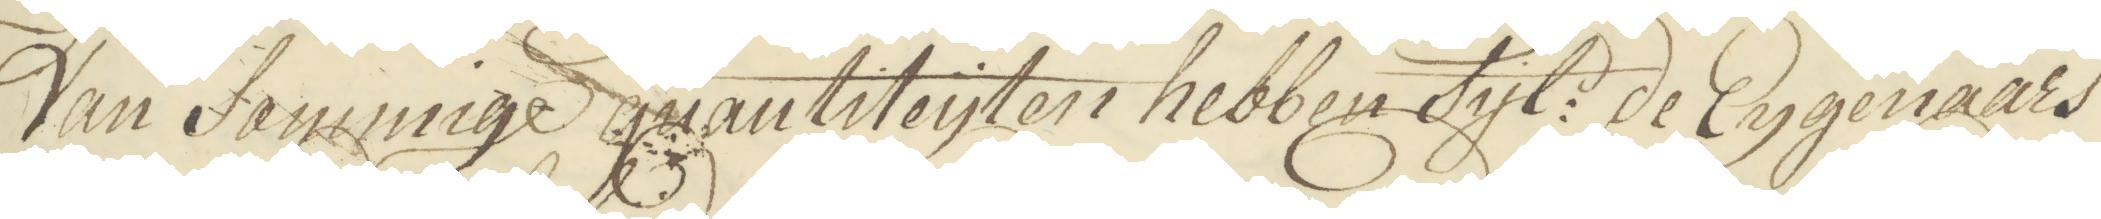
van sommige quantiteijten hebben sijl: de Eygenaars
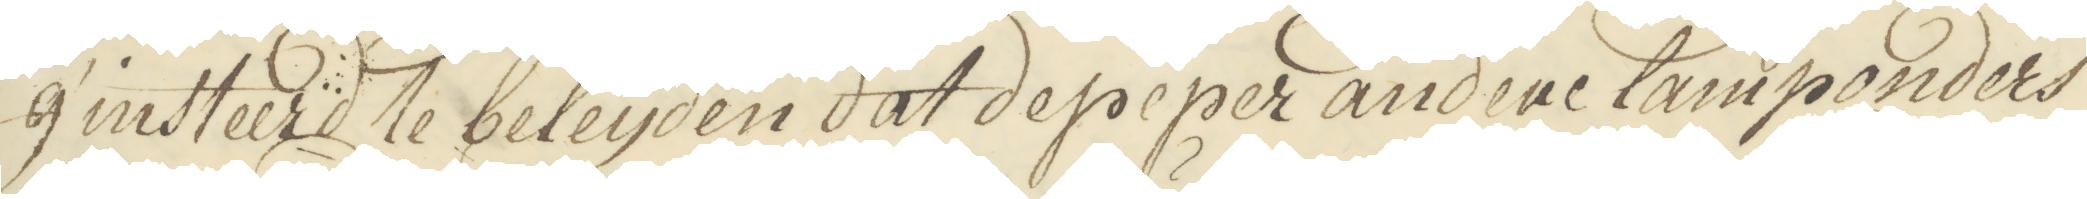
g'insteerd te beleijden dat de peper andere lamponders
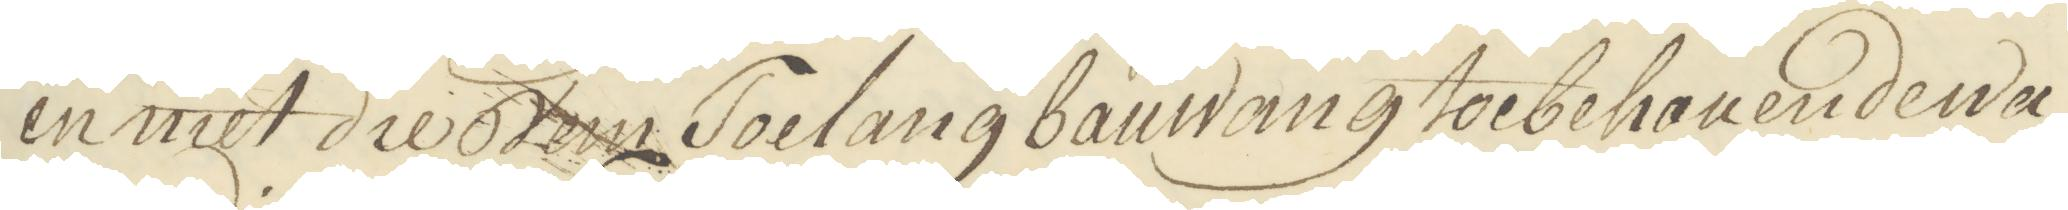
en niet die van Toelang bauwang toebehoren de wa
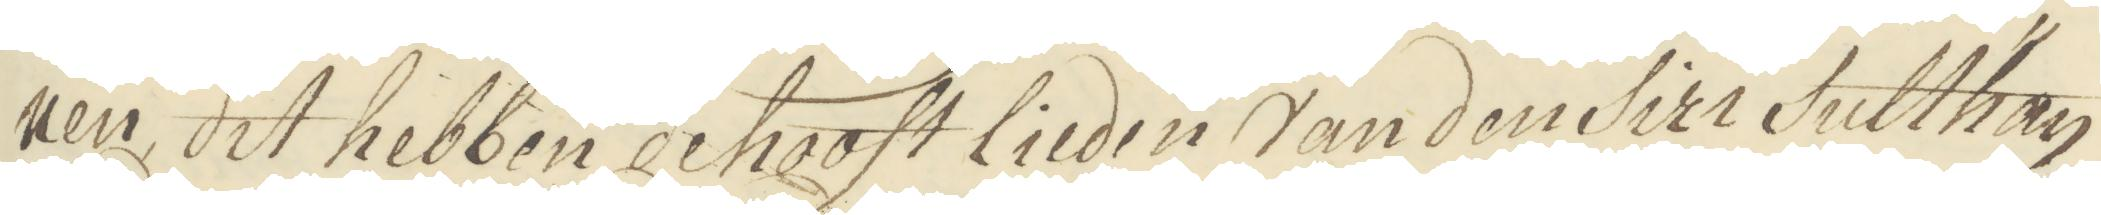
ren, dit hebben de hooft lieden van den siri sulthan
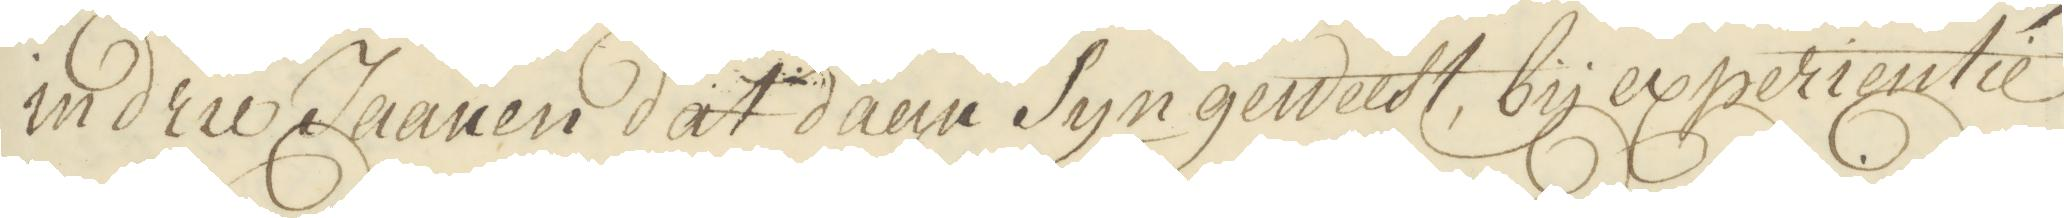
in drie Iaaren dat daar sijn geweest, bij experientie
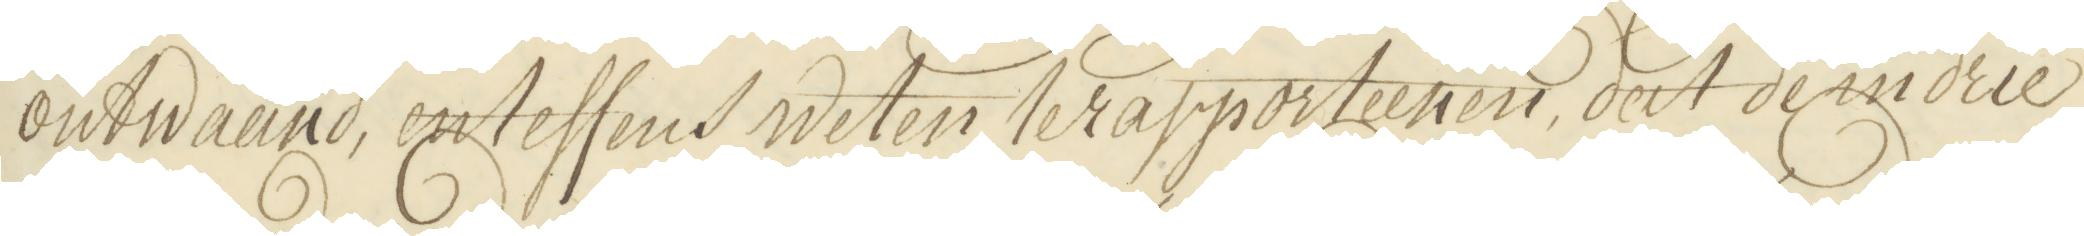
ontwaard, en teffens weten te rapporteeren, dat de in drie
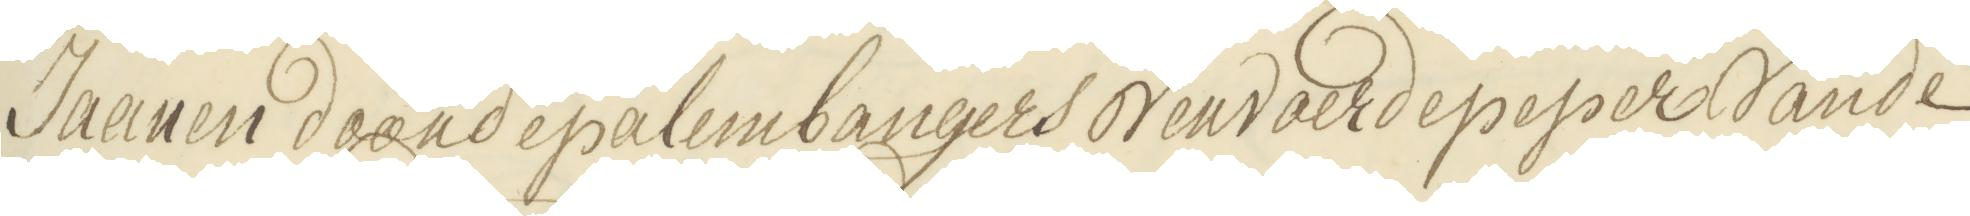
Iaaren door de palembangers vervoerde peper vande
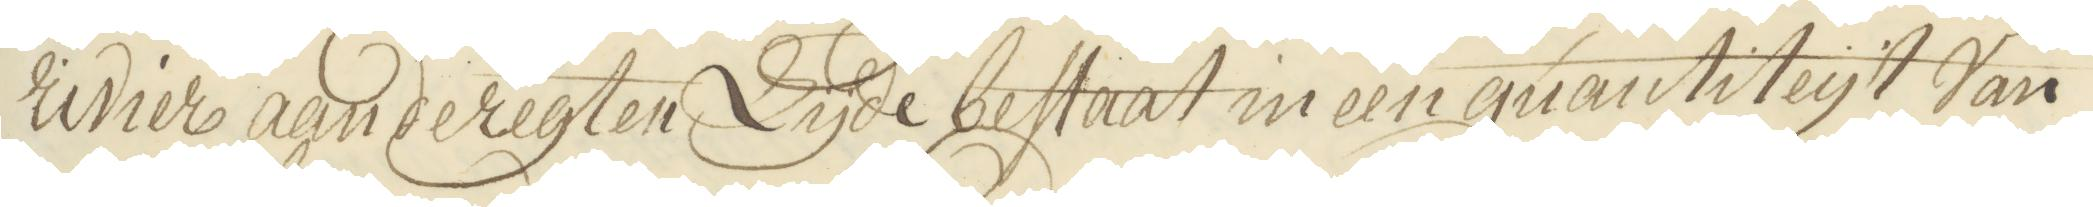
rivier aan de regter zijde bestaat in een quantiteijt van
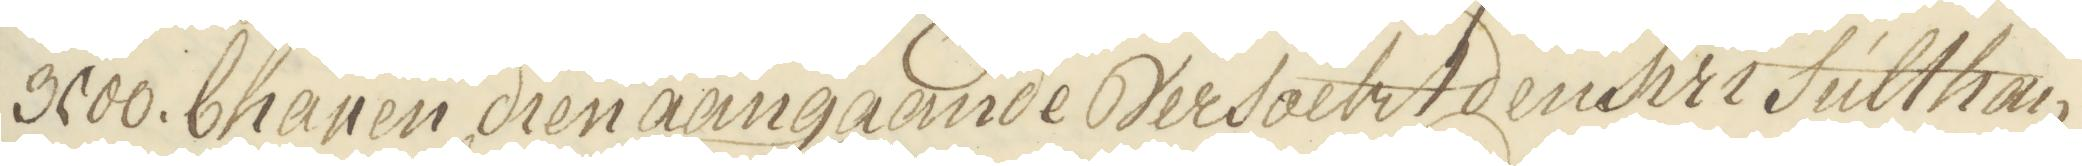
3500. bharen dien aangaande versoekt den siri sulthan
